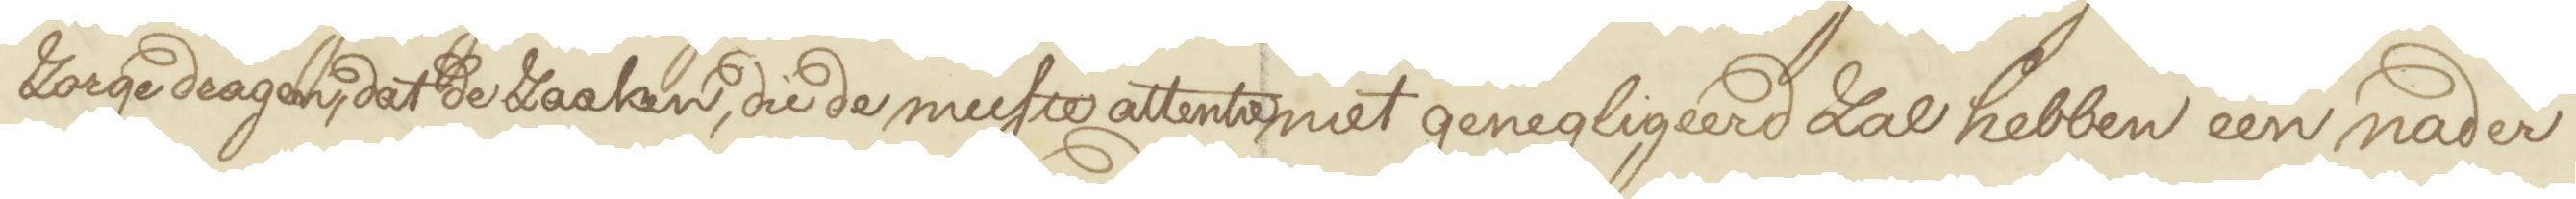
zorge dragen, dat de zaaken, die de meeste attente niet genegligeerd zal hebben een nader
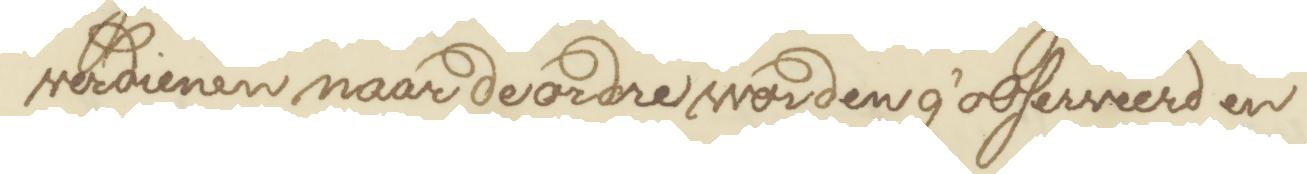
verdienen naar de ordre worden g’observeerd en
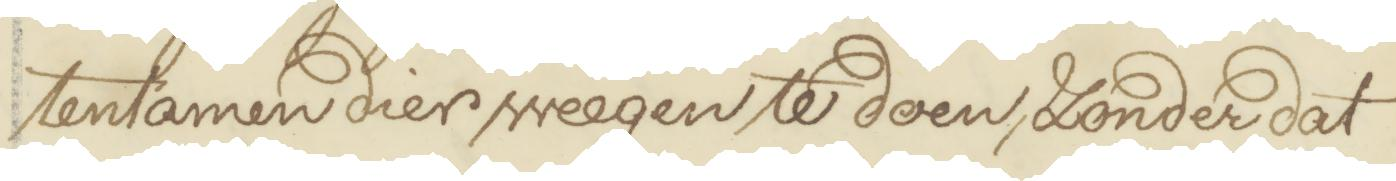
tentamen dier weegen te doen, zonder dat
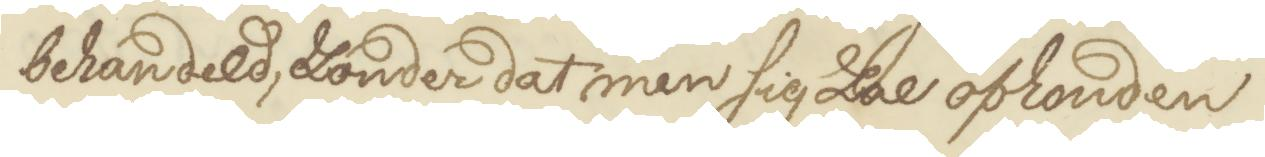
behandeld, zonder dat men sig zal ophouden
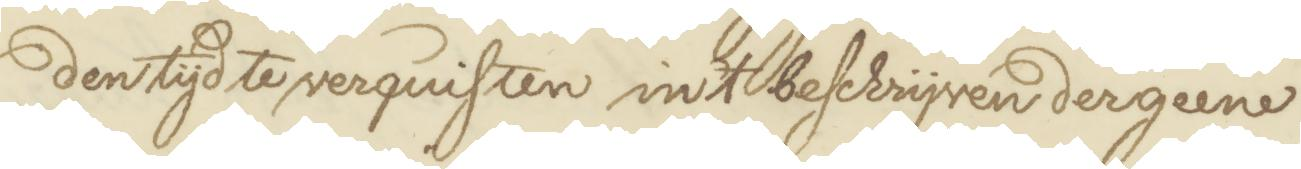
den tijd te verquisten in ’t beschrijven der geene
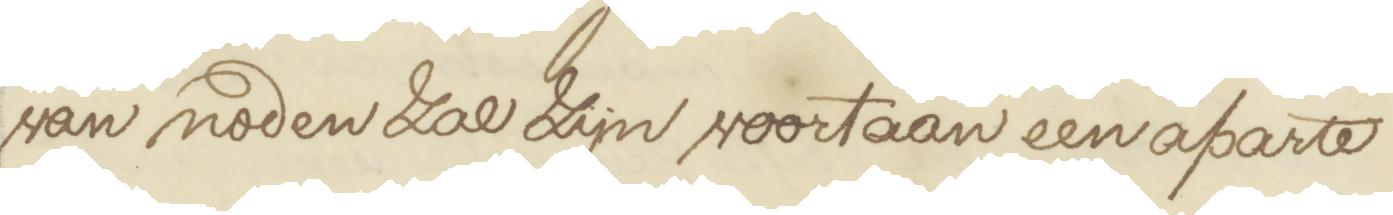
van noden zal zijn voortaan een aparte
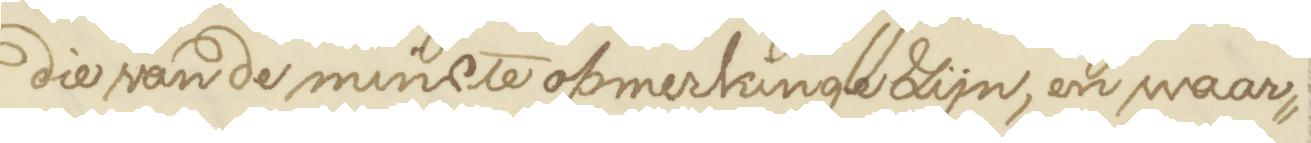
die van de minste opmerkinge zijn, en waar„
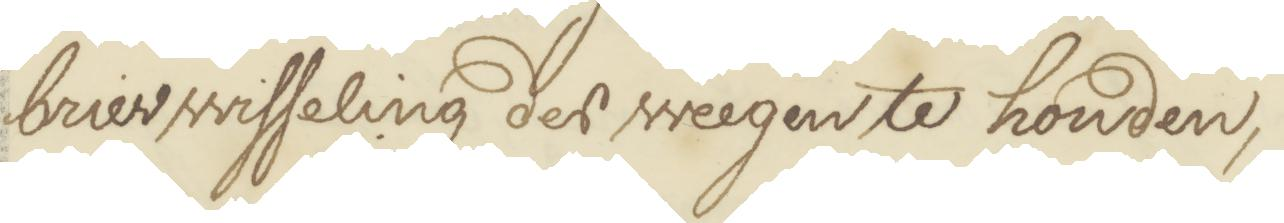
brievwisseling des weegen te houden,
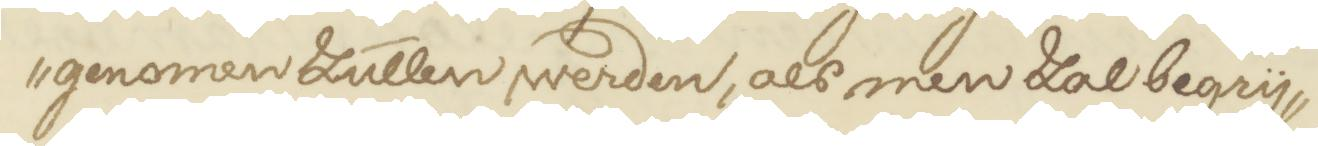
„genomen zullen werden, als men zal begrij„
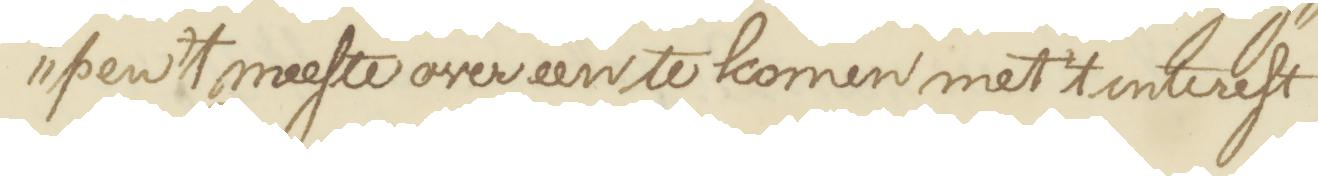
„pen 't meeste over een te komen met ’t intrest
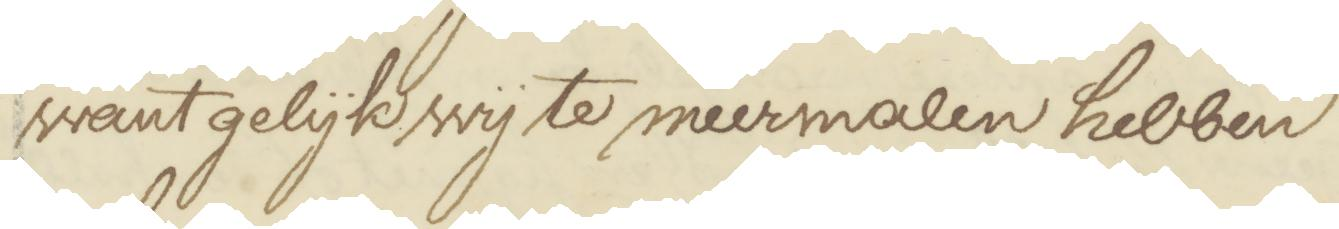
want gelijk wij te meermalen hebben
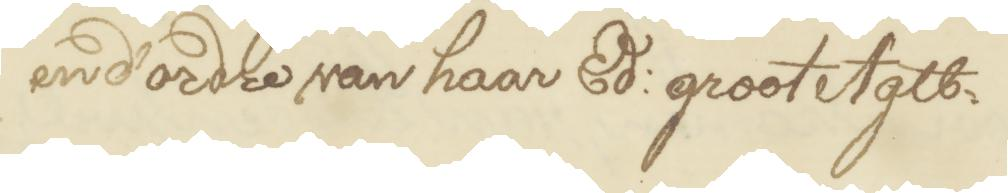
en d'ordre van haar Ed: groot Agtb:
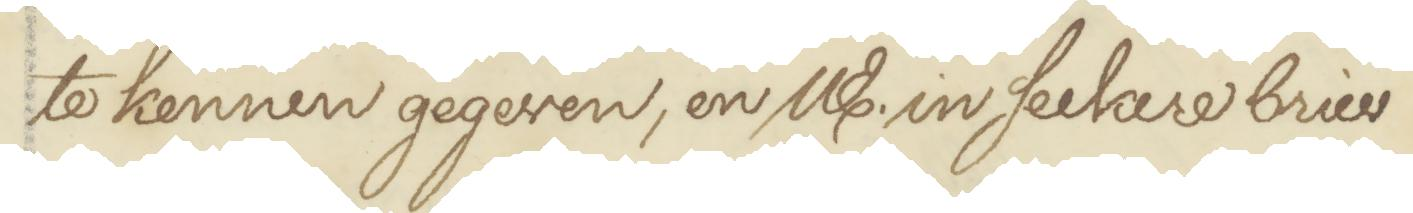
te kennen gegeven, en UE. in seekere briev
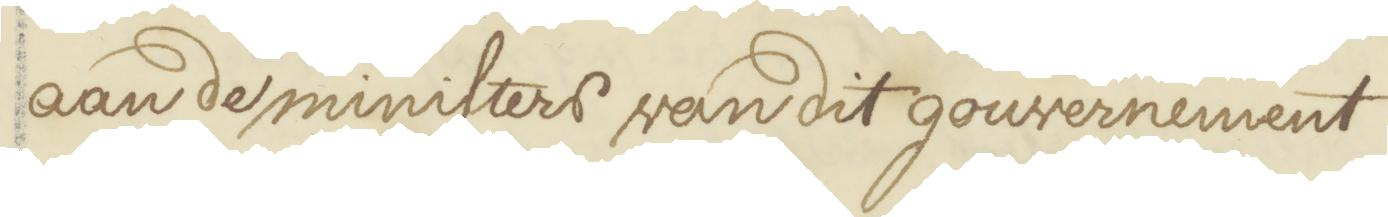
aan de ministers van dit gouvernement
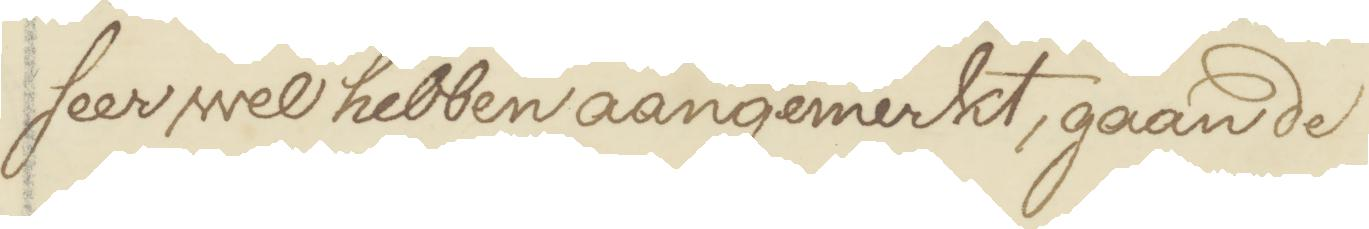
seer wel hebben aangemerkt, gaan de
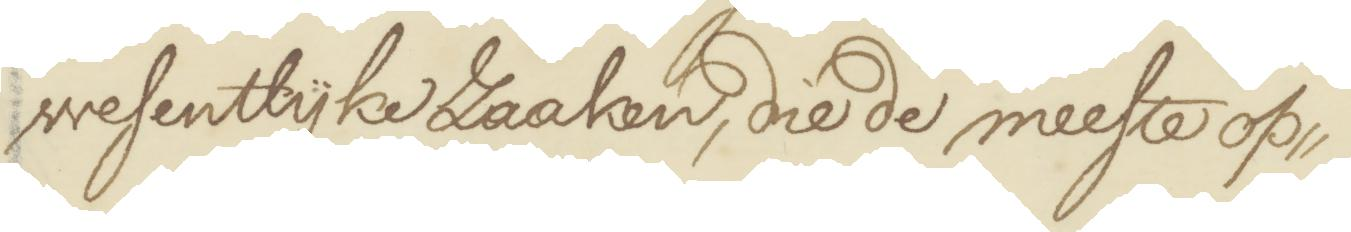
wesentlijke zaaken, die de meeste op„
